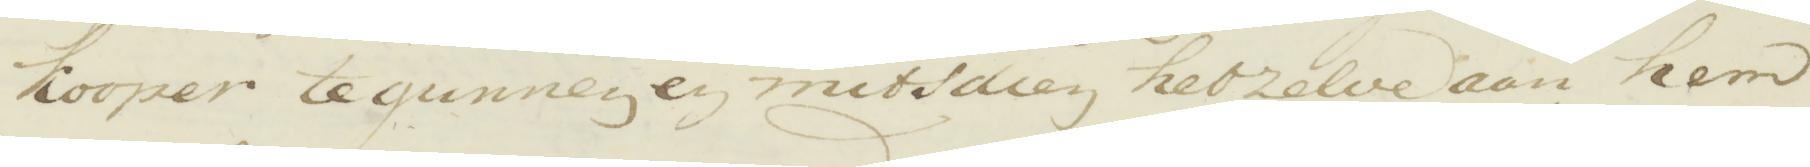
kooper te gunnen en mitsdien hetzelve aan hem
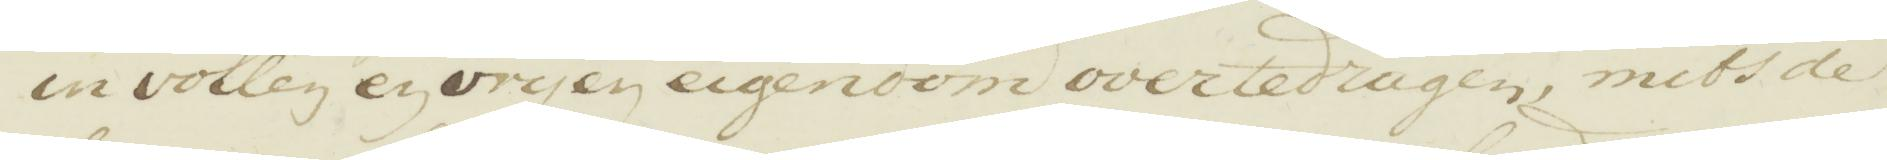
in vollen en vryen eigendom over tedragen, mits de
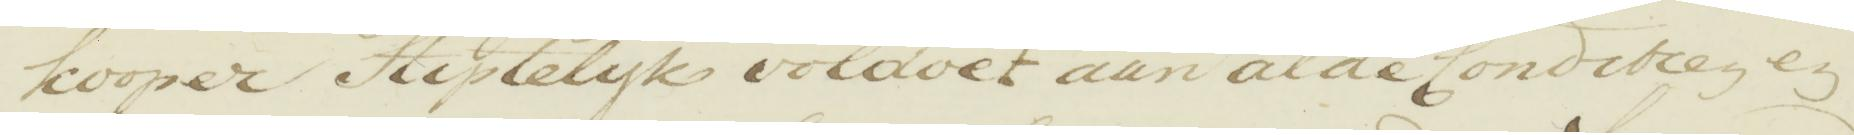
kooper stiptelyk voldoet aan al de Conditien en
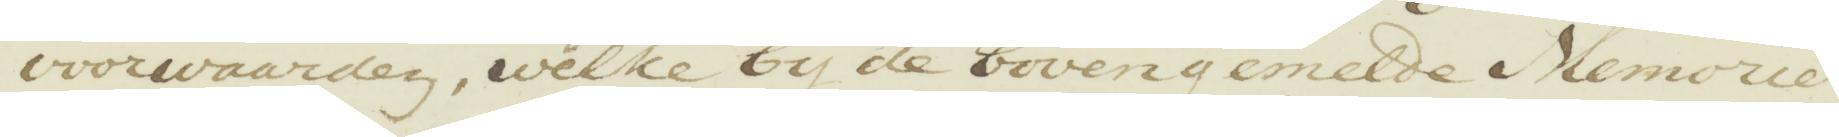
voorwaarden, welke by de bovengemelde Memorie
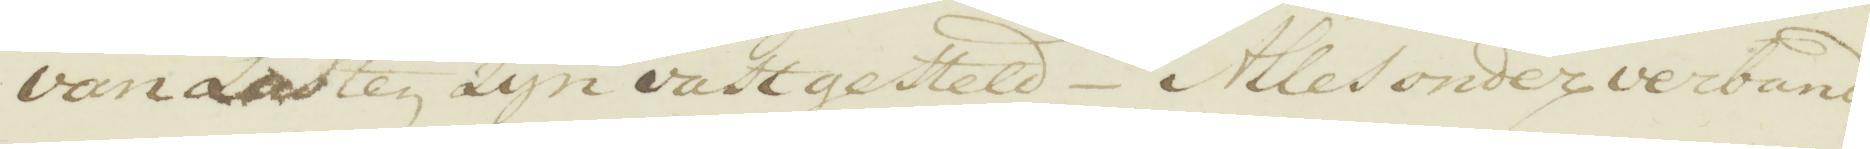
van Lasten zyn vastgesteld - Alles onder verband
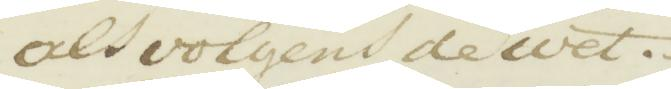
als volgens de wet.
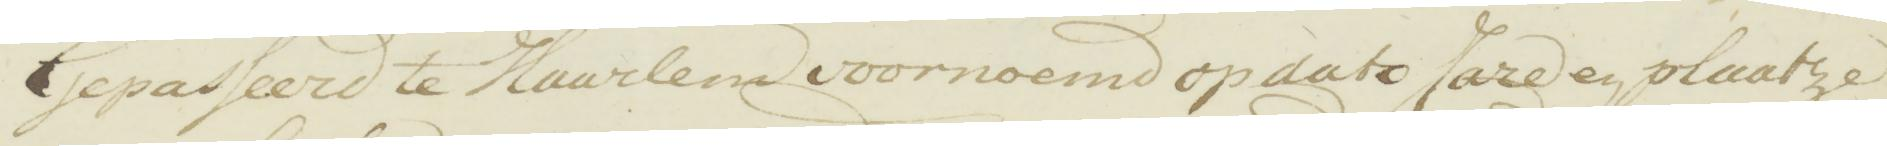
Gepasseerd te Haarlem voornoemd op dato Jare en plaatze
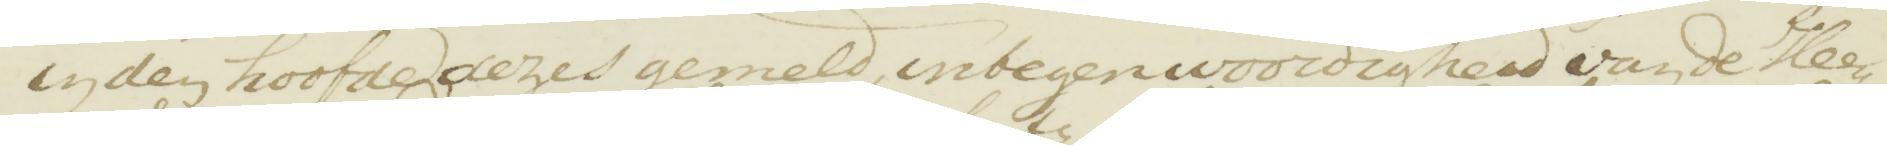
in den hoofde dezes gemeld, integenwoordigheid van de Hee„
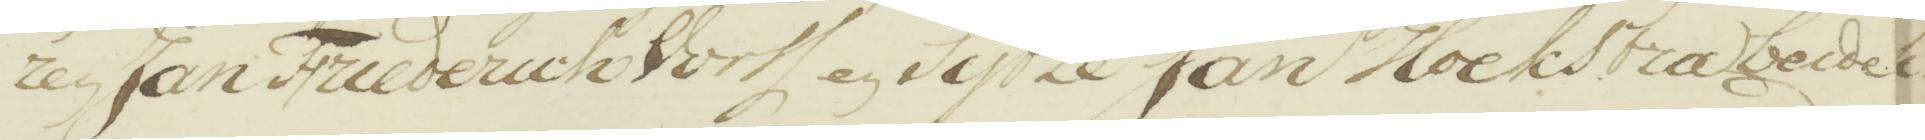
ren Jan Friederich Vorss en Sytze Jan Hoekstra beide
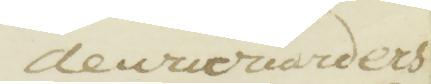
deurwaarders
